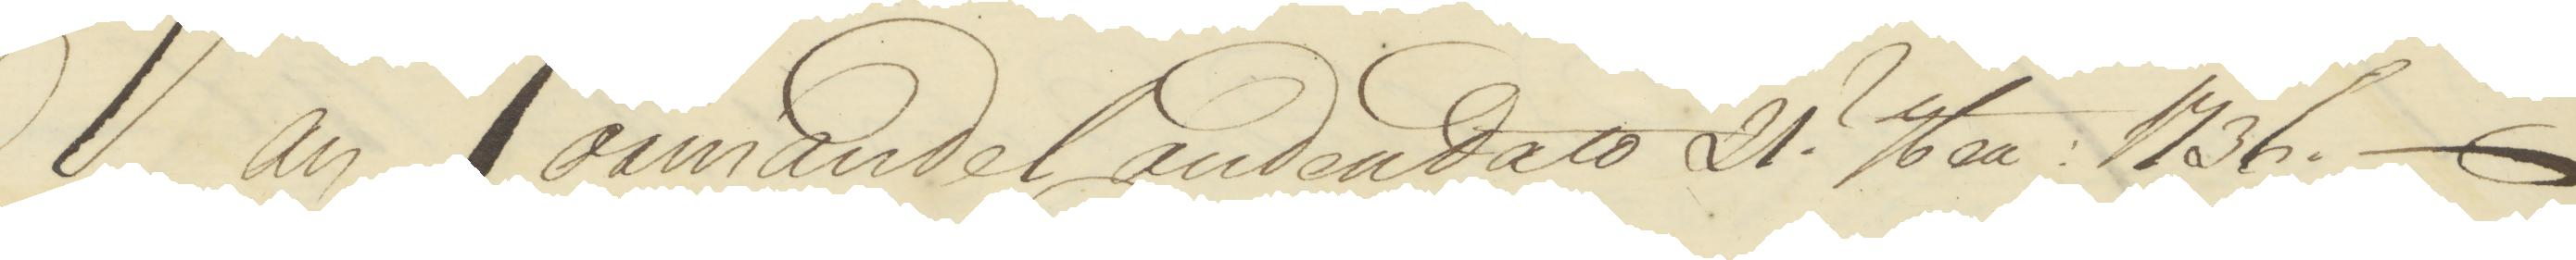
Van Cormandel onder dato 21.' 7ber: 1736„ —
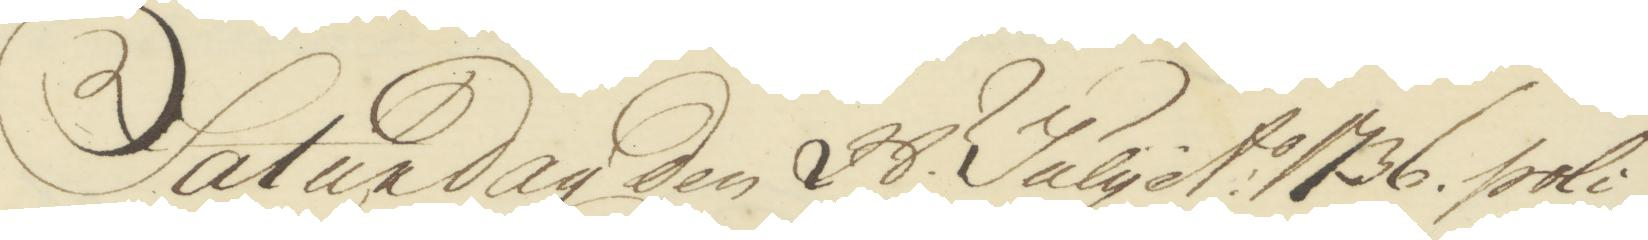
Saturdag den 28.' Iulij A:o 1736. poli
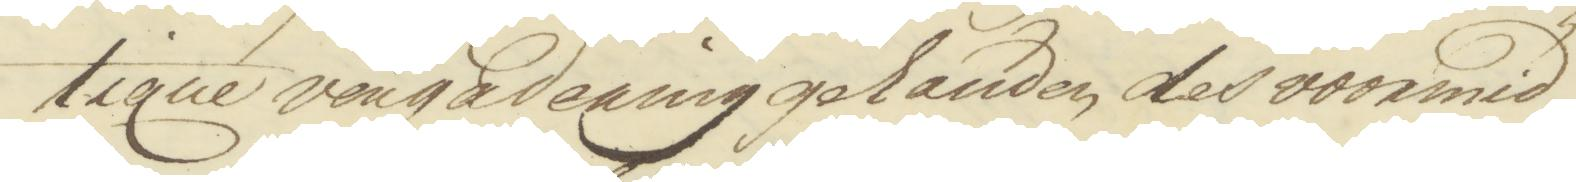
tique vergadering gehauden des voormid
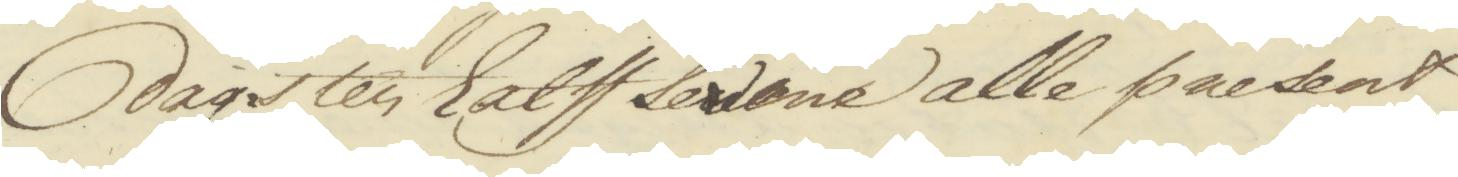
dags ten halff sevene alle present
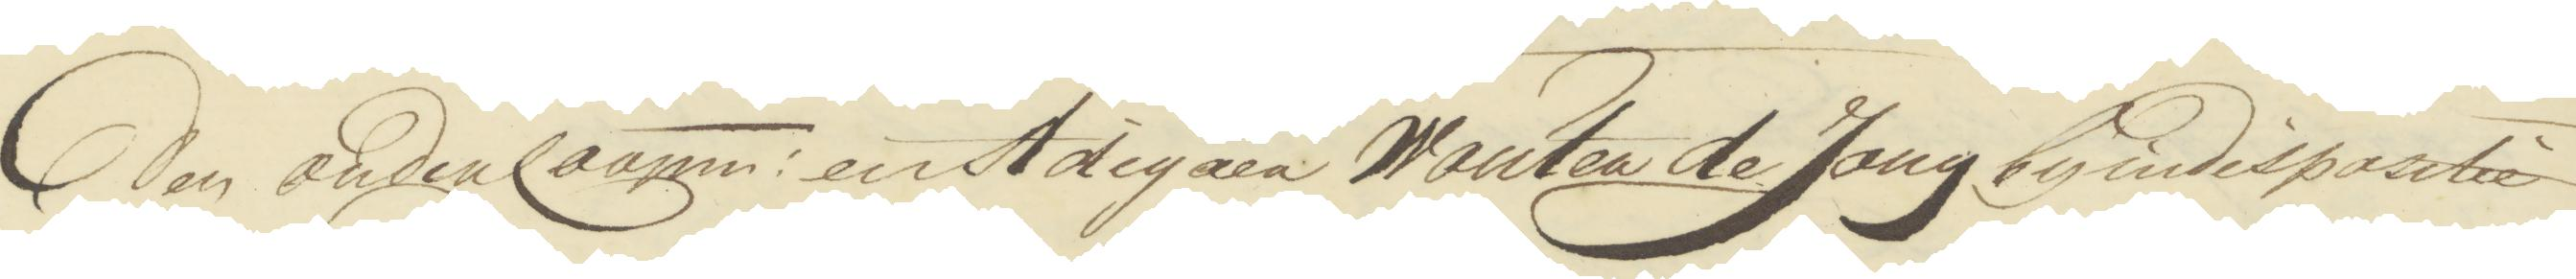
den ondercoopm: en Adigaer Wauter de Jong by indispositie
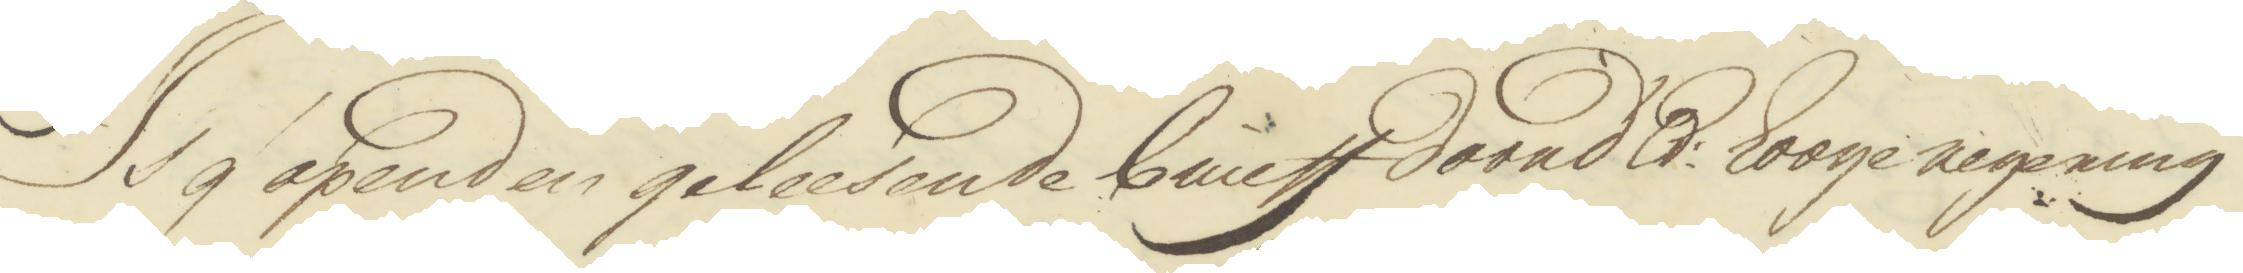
Is g’opend en geleesende brieff door d' Ed: hooge regering
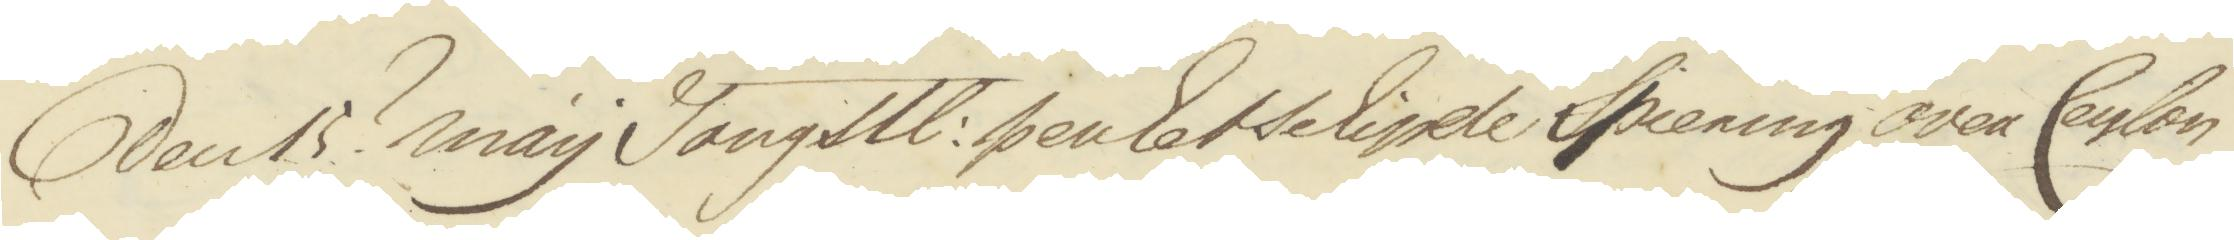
den 15.' maij Iongstl: per het schip de spiering over Ceylon
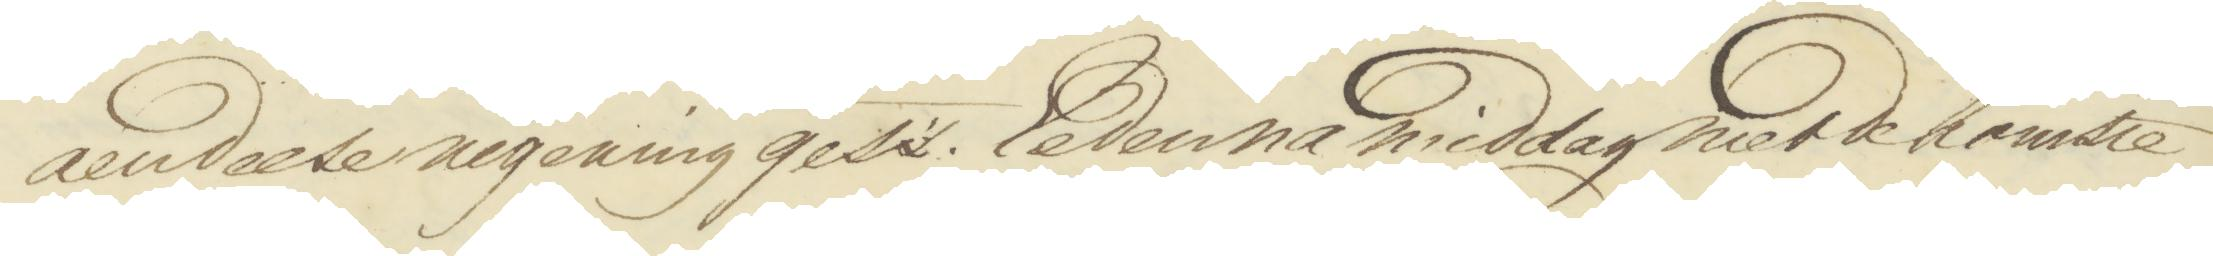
aen deese regering gesz. heden na middag niet de komste
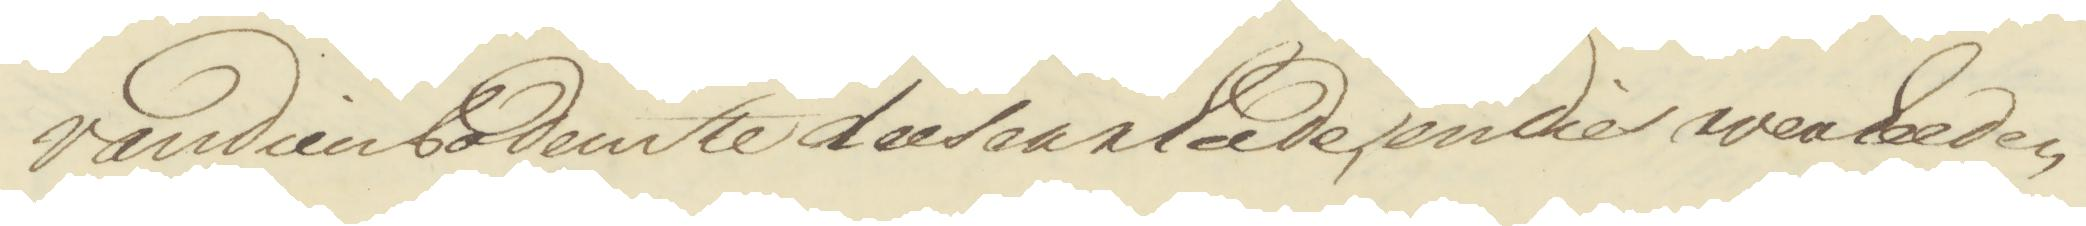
vandien bodem te deeser rheede, en dies roerheeden
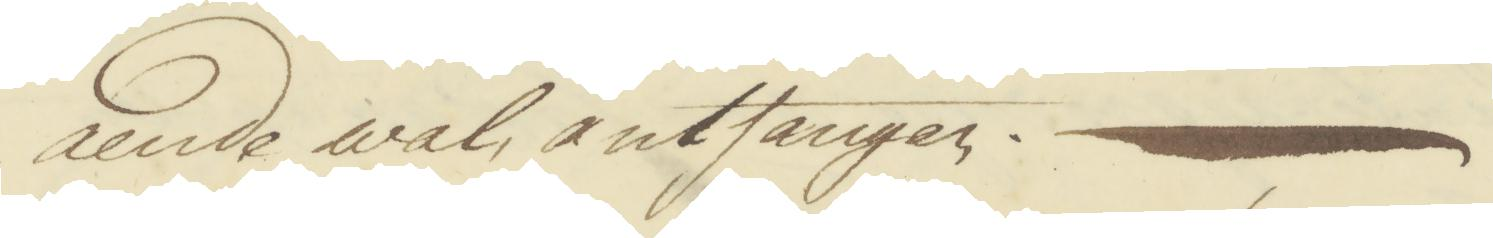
aende wal, ontfangen. —
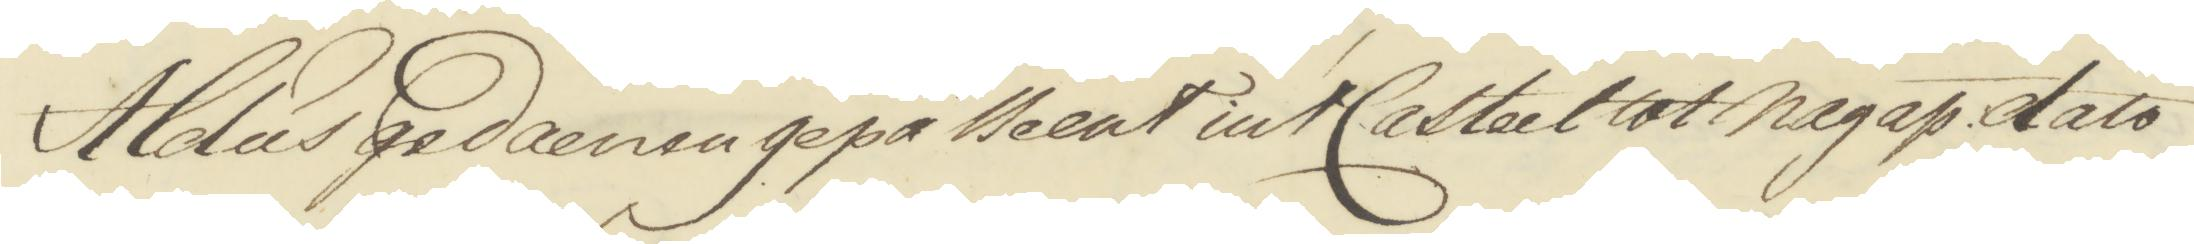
Aldus gedaen en gepasseert in't Casteel tot Negap dato
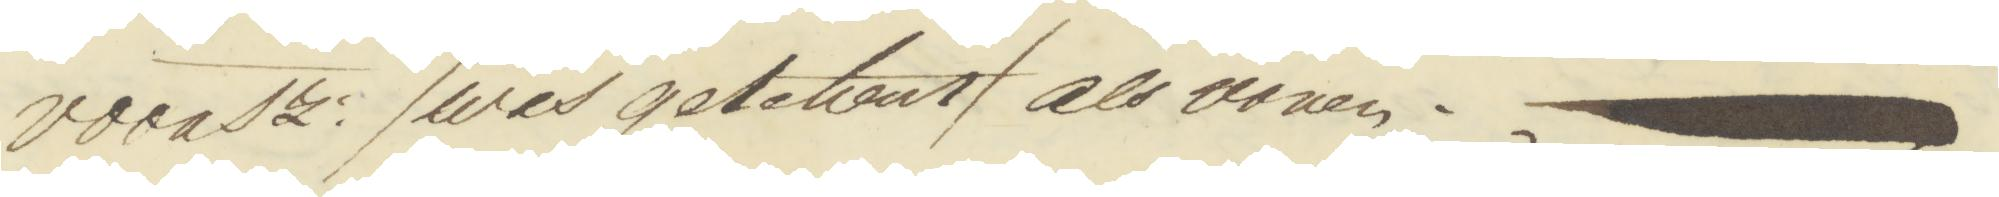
voorsz: /was getekent/ als voren. —
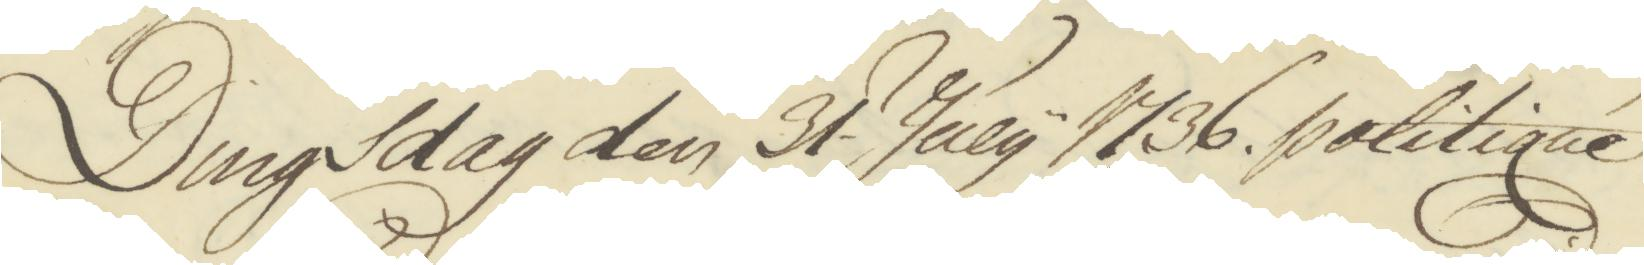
Dingsdag den 31.' Julij 1736. politique
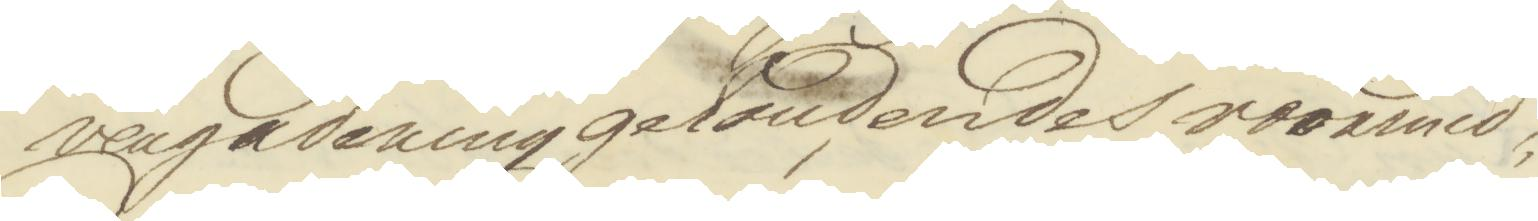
vergadering gehouden des voormid„
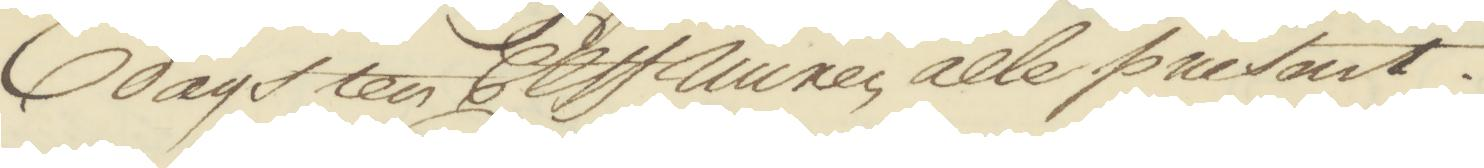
dags ten Elff Uuren alle present.
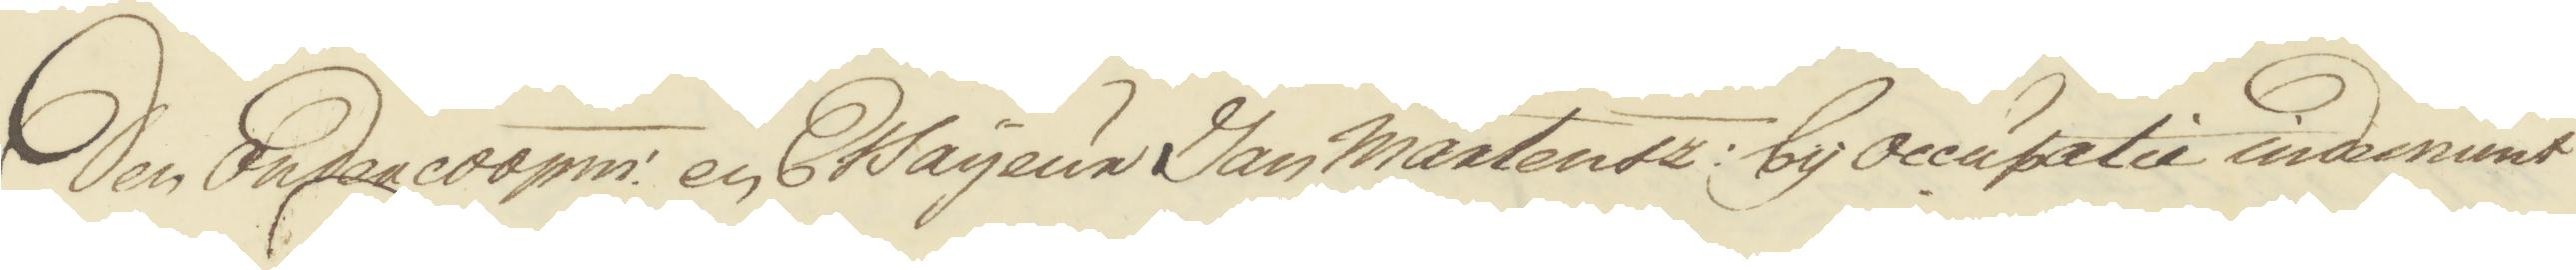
den ondercoopm: en Essaijeur Ian Martensz: bij occupatie indemunt
